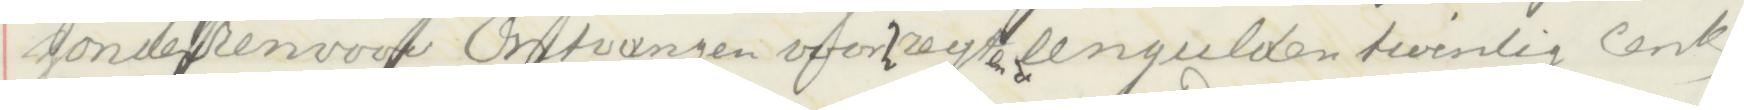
zonder renvooi Ontvangen voor 2 regten x een gulden twintig Cent
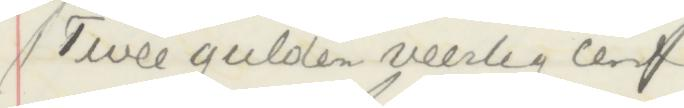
Twee gulden veertig Cent
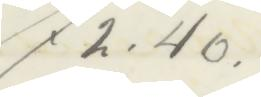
ƒ 2. 40.
